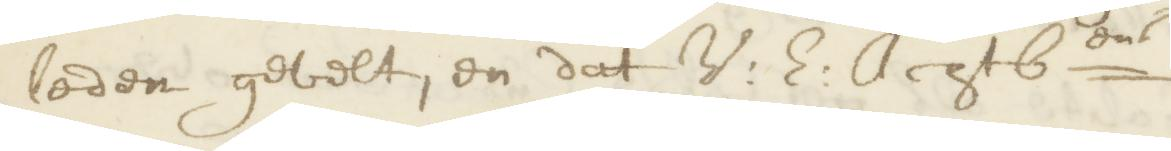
leden gevelt, en dat V: E: Achtb=ens
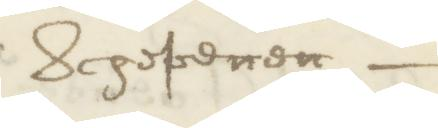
Schepenen
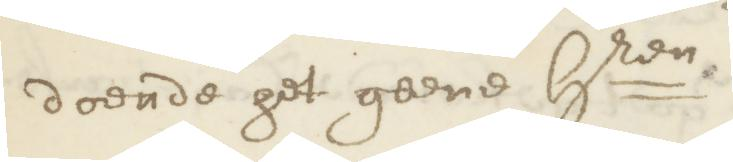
doende het geene H=ren
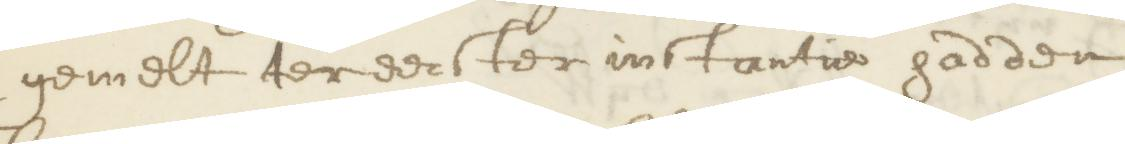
gemelt ter eerster instantie hadden
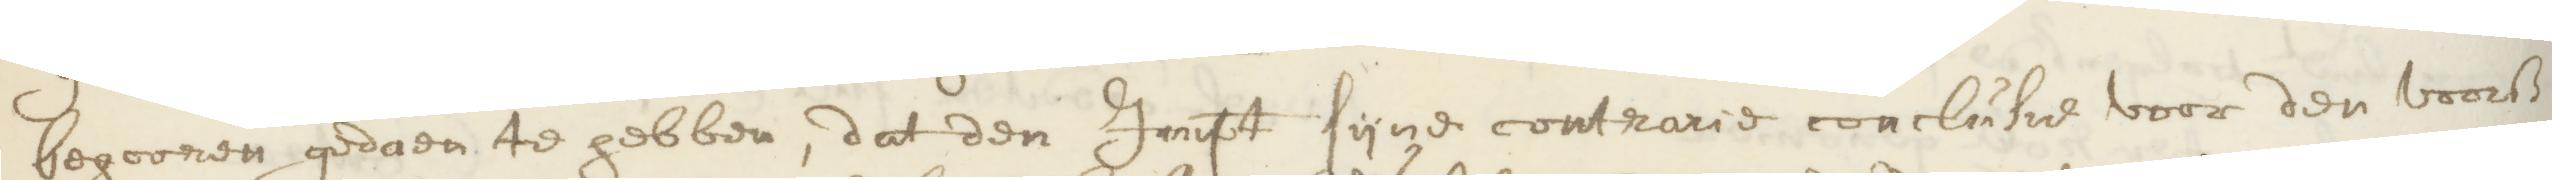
behooren gedaen te hebben, dat den Jmpt sijne contrarie conclusie voor den voorsz
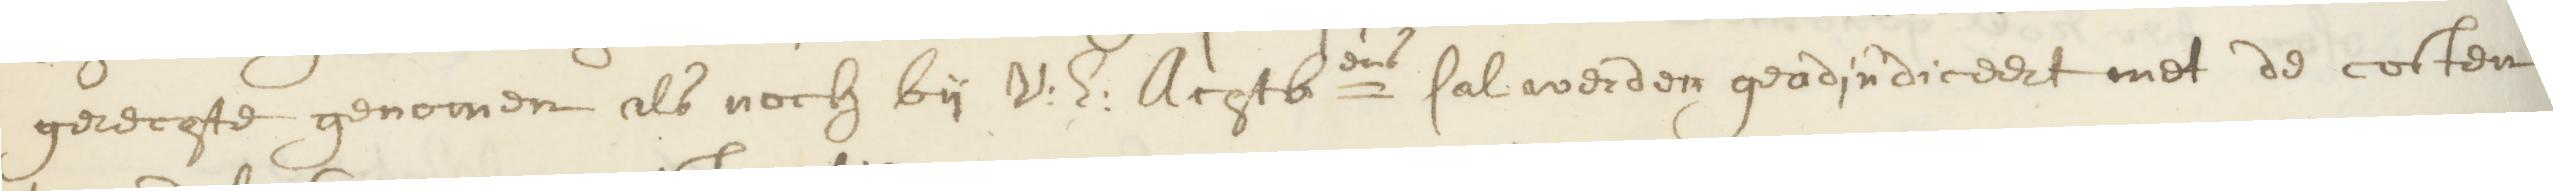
gerechte genomen als noch bij V: E: Agtb=ens sal werden geadjudiceert met de costen
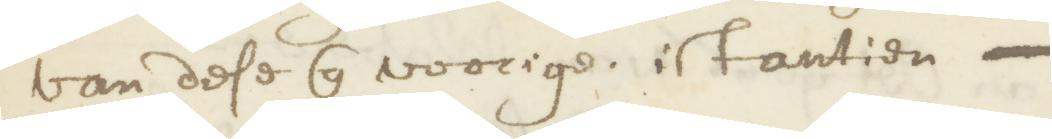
van dese ende voorige istantien
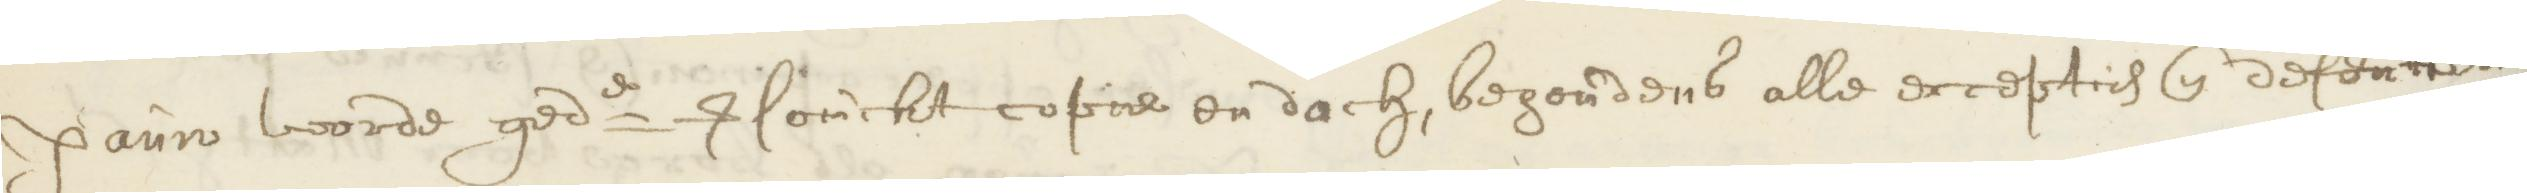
pauw voorde ged=e versouckt copie en dach, behoudens alle exceptien ende defentien
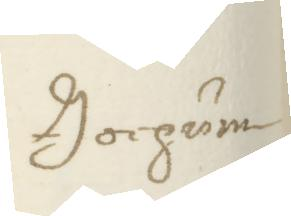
Jochum
